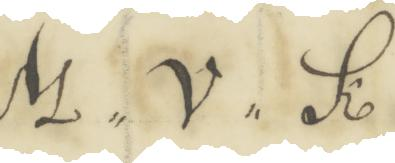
M„ V„ K
